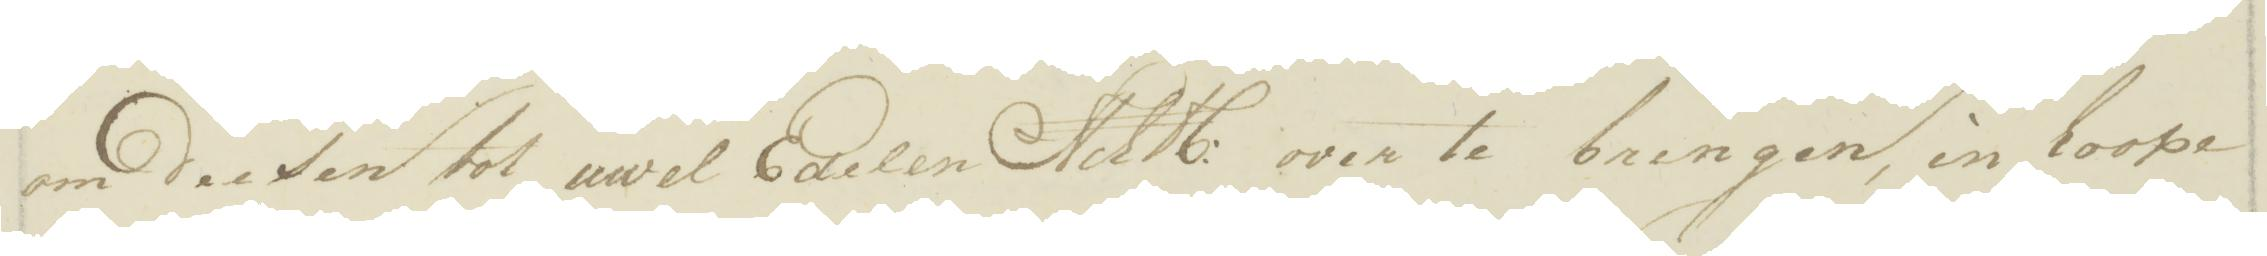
om deesen tot uwel Edelen Achtb: over te brengen, in hoope
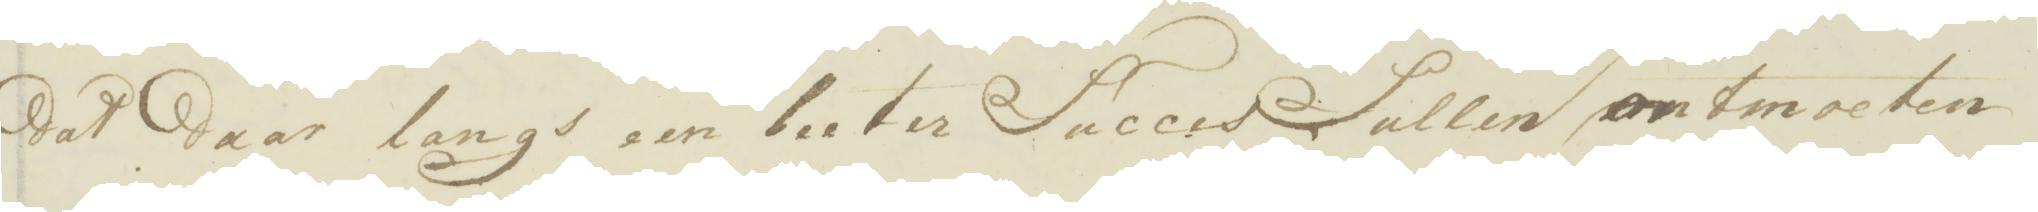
dat daar langs een beeter succes sullen ontmoeten
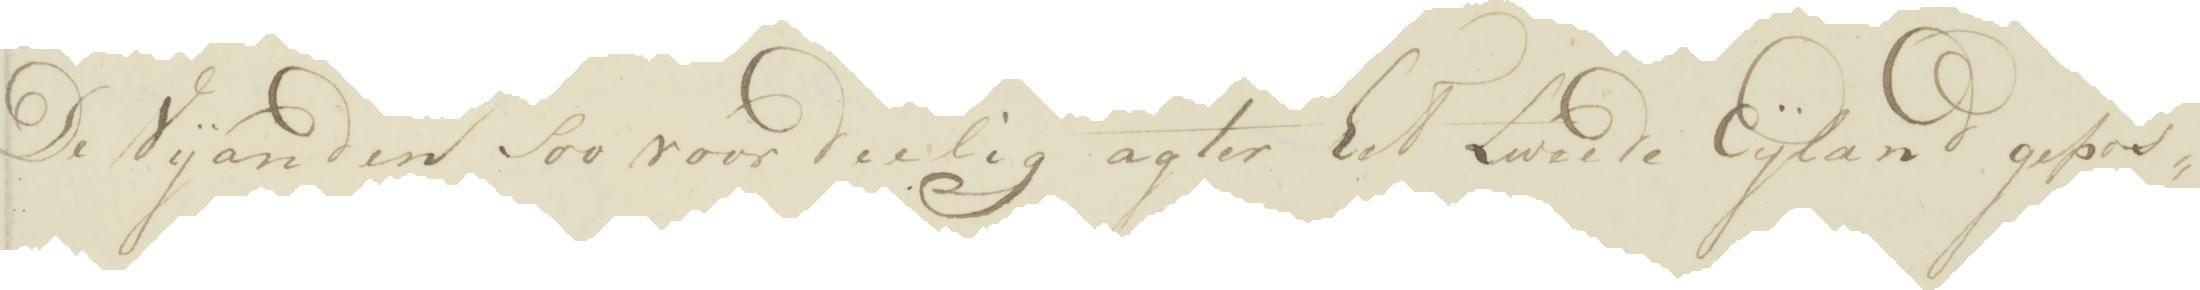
De vijanden so voordeelig agter het tweede Eijland gepos„
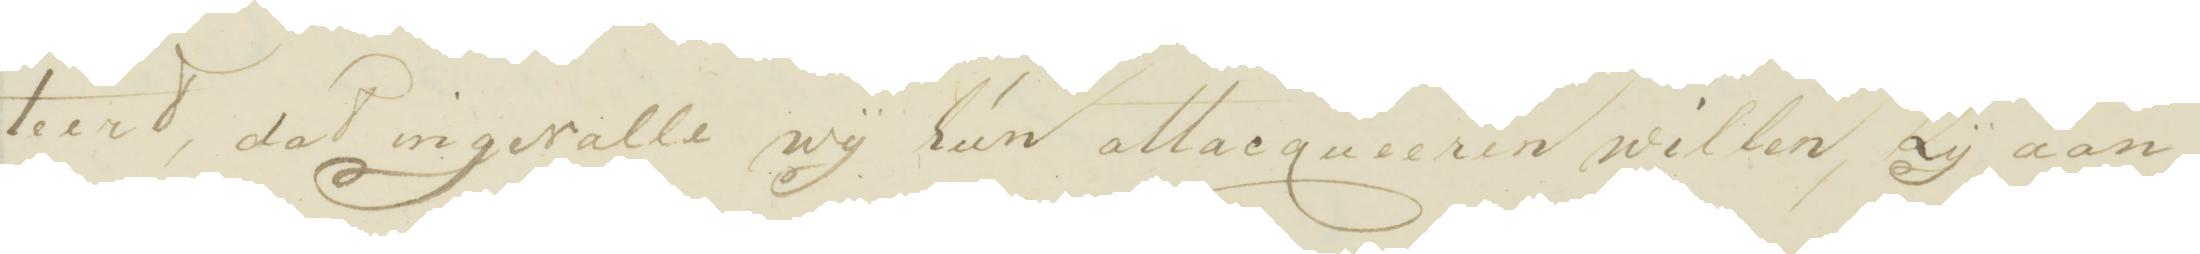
teerd, dat ingevalle wij hun attacqueeren willen, zij aan
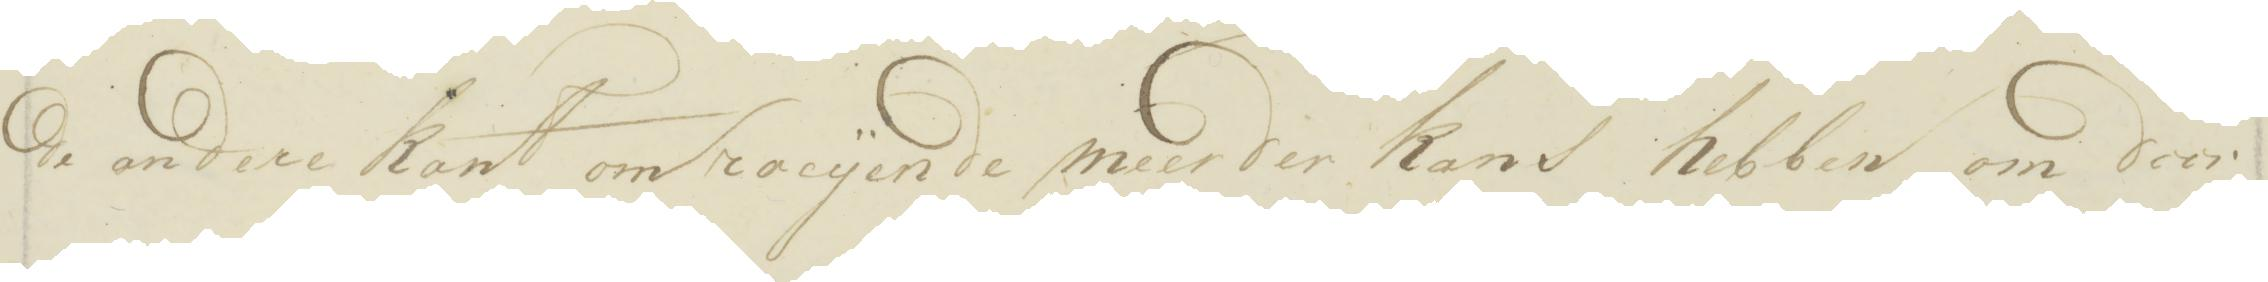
de andere kant om roeijende meerder kans hebben om door
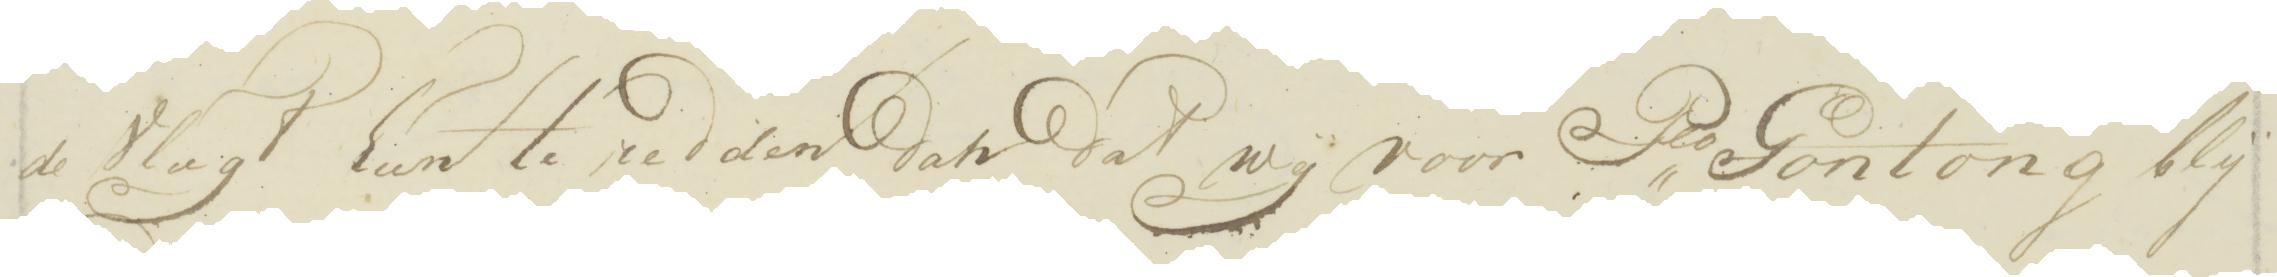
de vlugt hun te redden dan dat wij voor P„lo Gontong blij
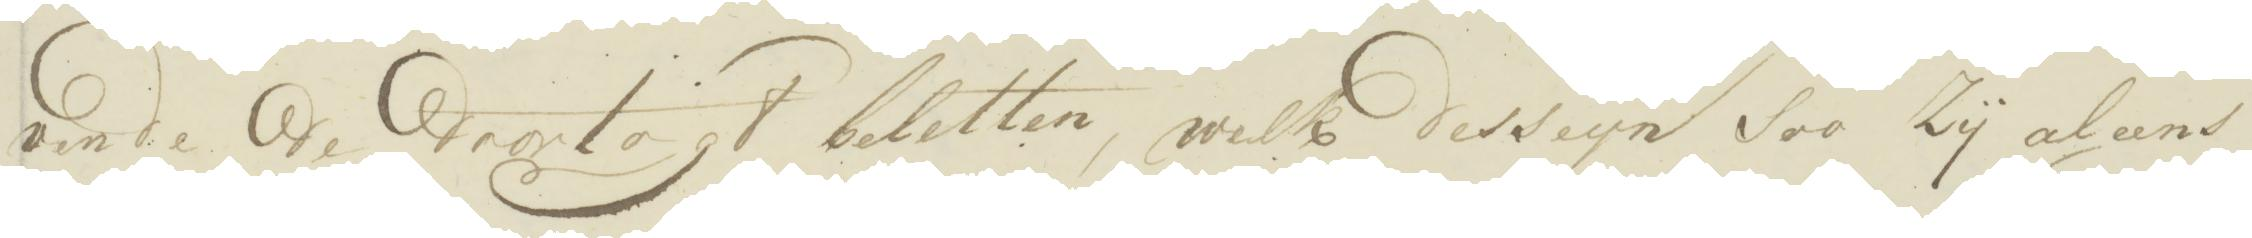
vende de doortogt beletten, welk desseijn soo zij al eens
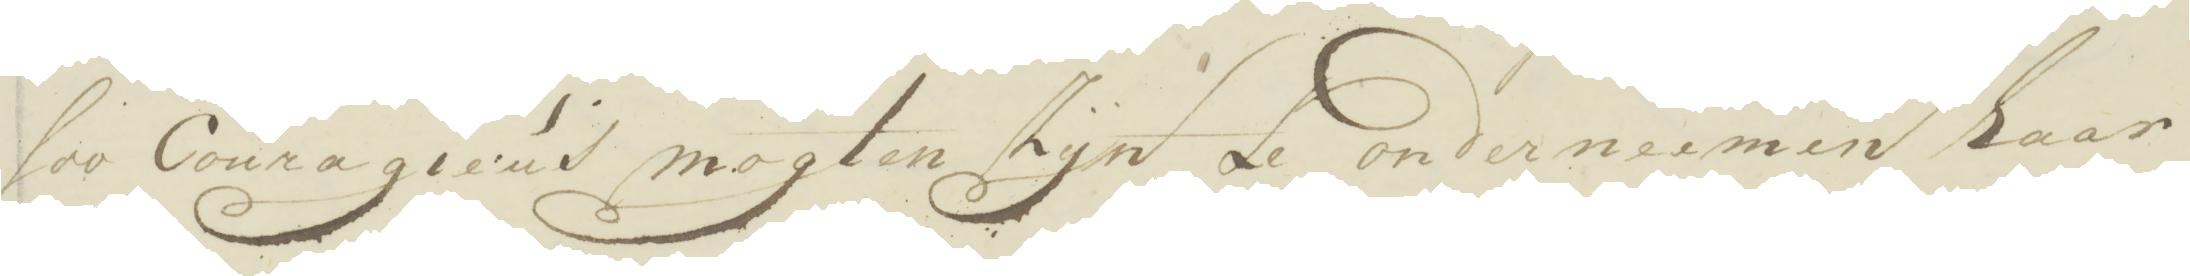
soo couragieus mogten zijn te onderneemen haar
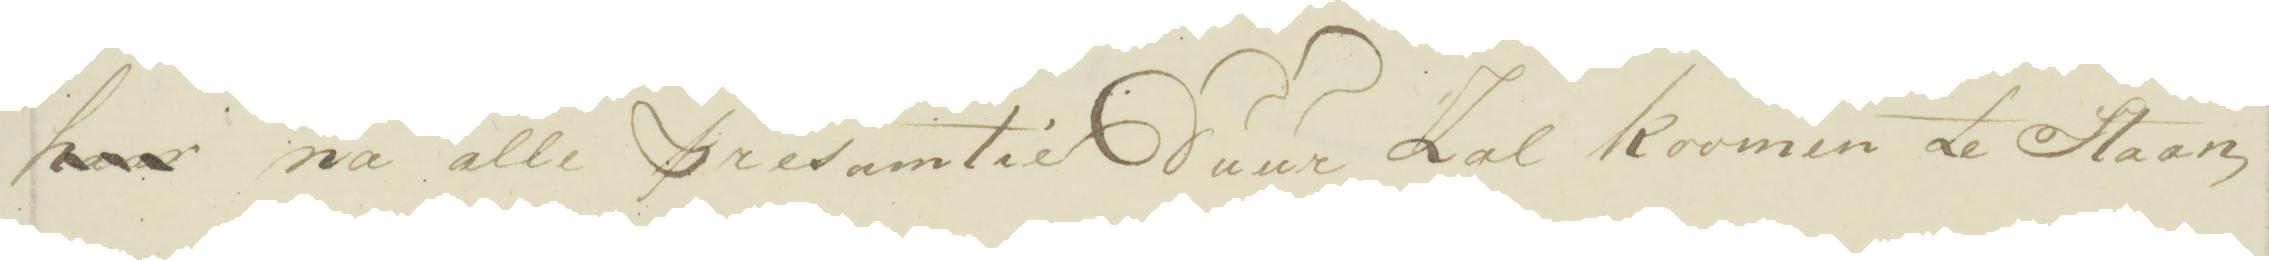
haar na alle presumtie duur zal koomen te staan
